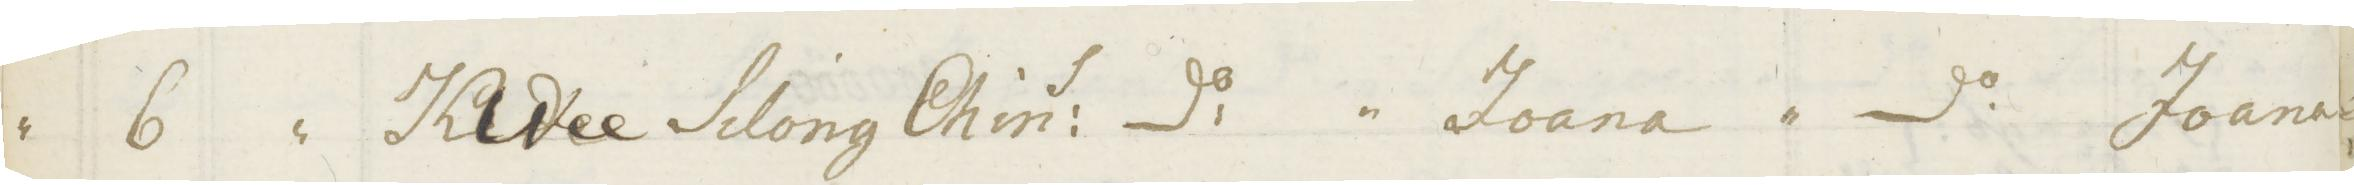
„ 6 „ Kwee silong Chin:s _:o „ Joana „ _:o Joana
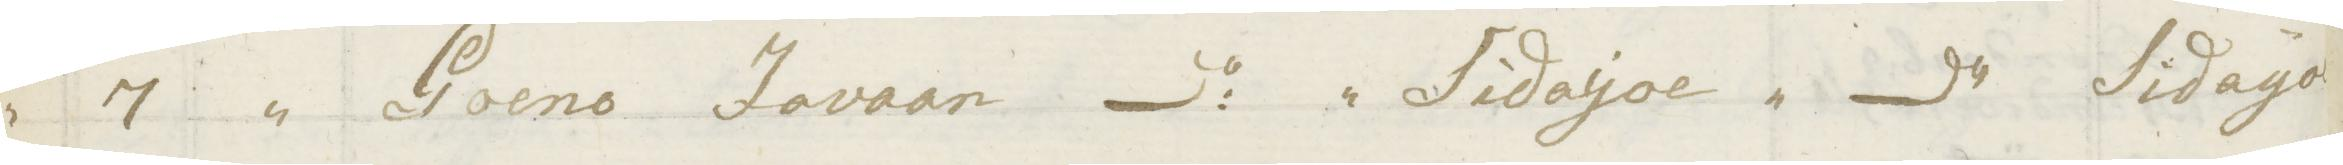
„ 7 „ Goeno Javaan _:o „ sidaijoe „ _:o sidaijoe
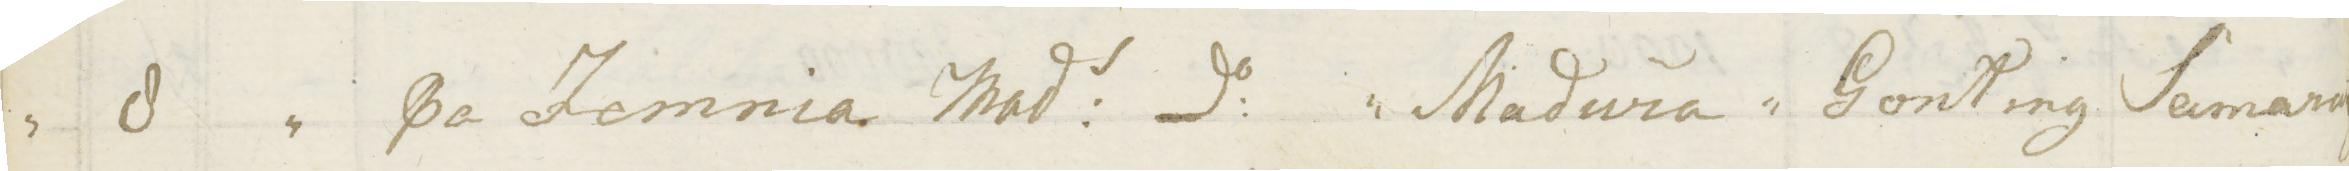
„ 8 „ pa Jemnia Mad:s _:o „ Madura „ Gonting samara
